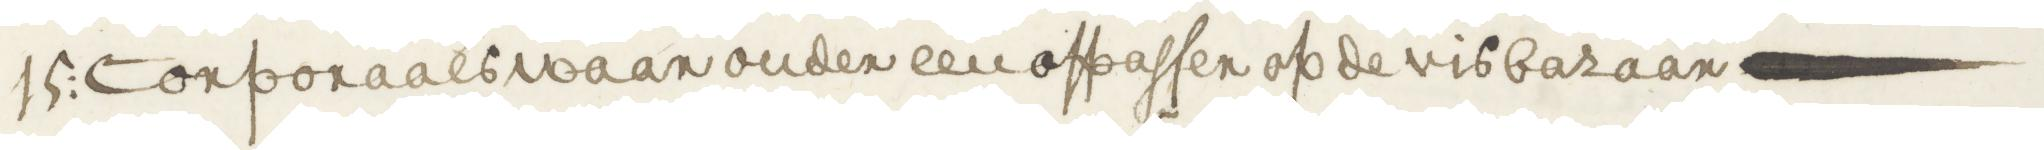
15: Corporaals waar onder een oppasser op de visbazaar —
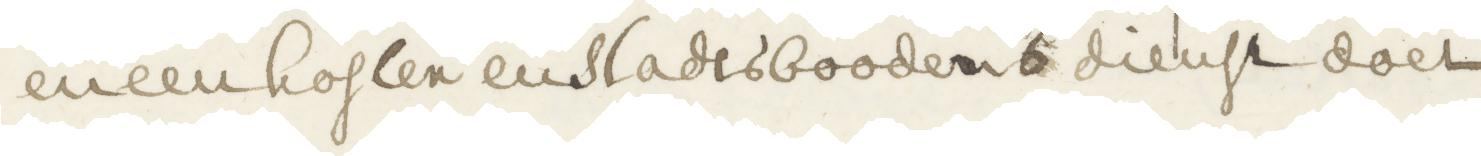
en een koster en stadts boodens dienst doet
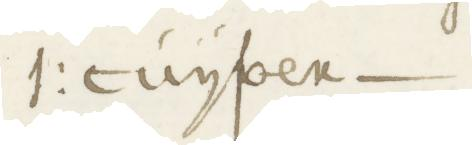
1: cuijper —
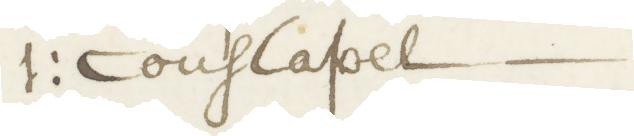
1: constapel —
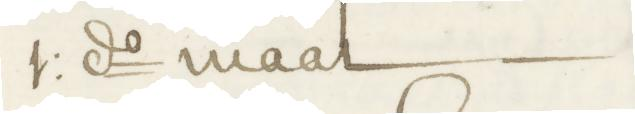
1: d=o maat —
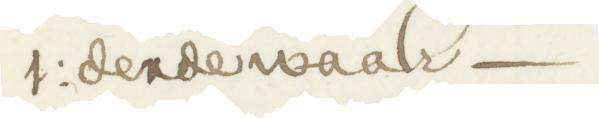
1: derde waak —
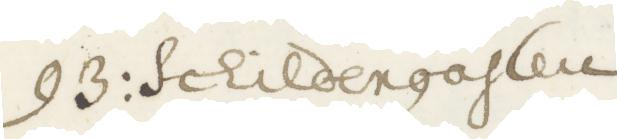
93: schildergasten
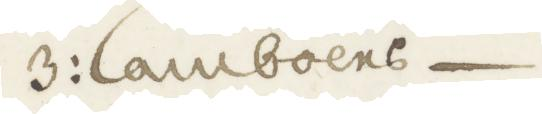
3: tamboers —
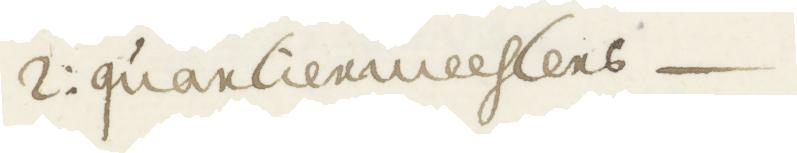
2: quartiermeesters —
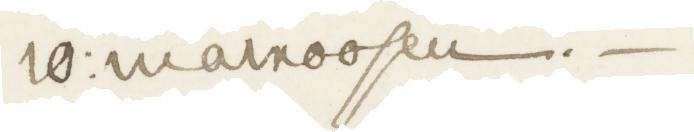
10: matroosen. —
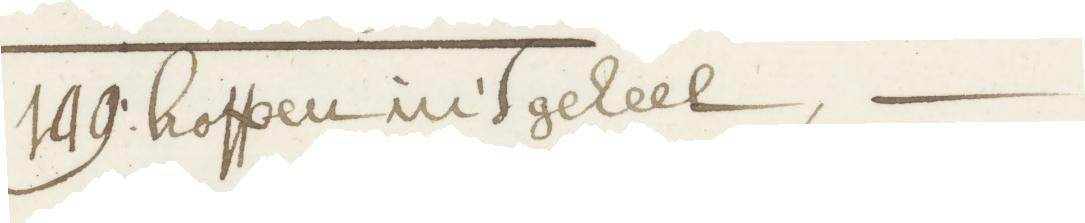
149: koppen in 't geheel, —
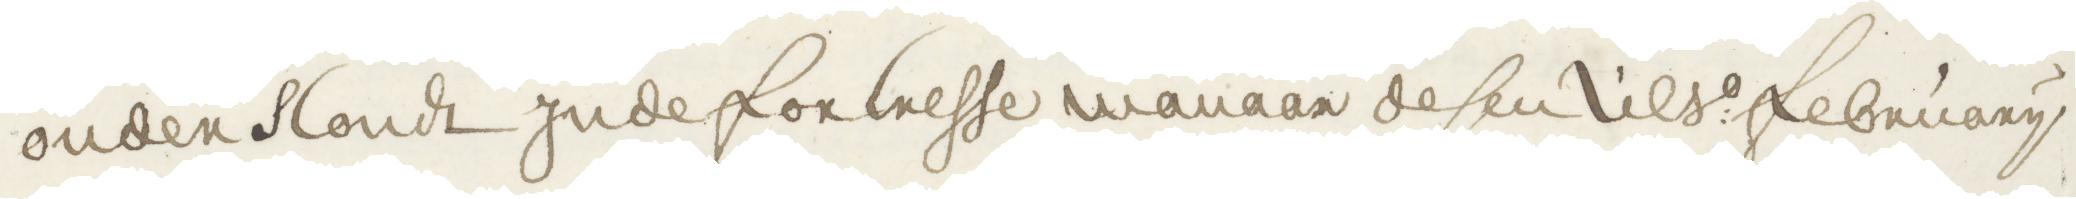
onderstondt Jn de fortresse manaar desen ult:o februarij
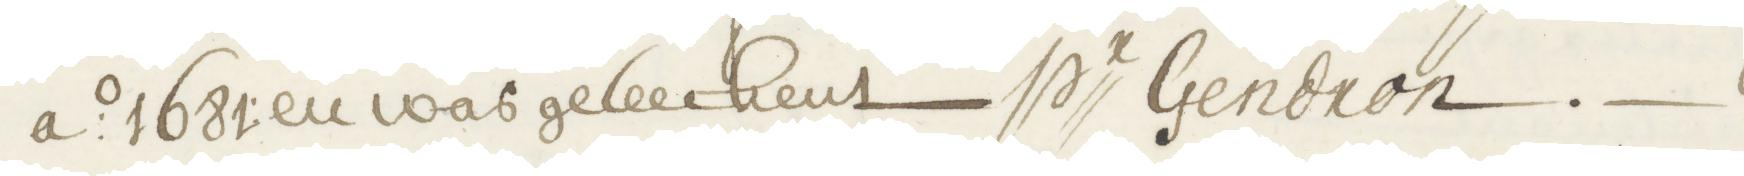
a:o 1681: en was geteeckent p„r Gendron. —
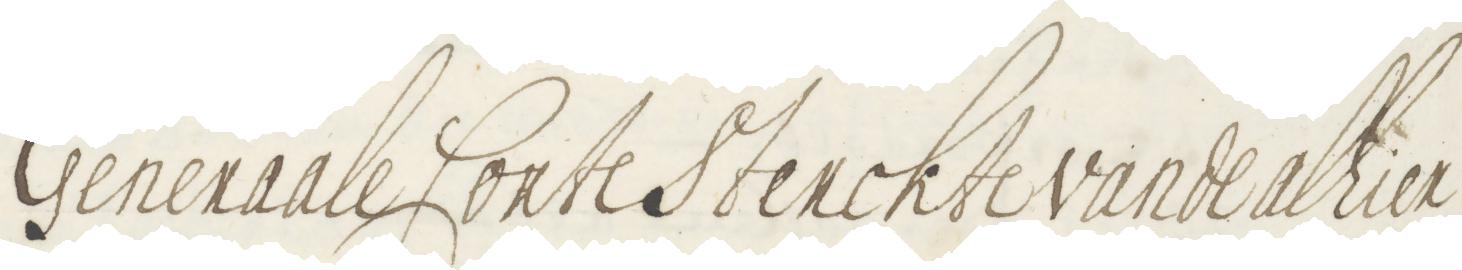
Generaale Corte Sterckte van de alhier
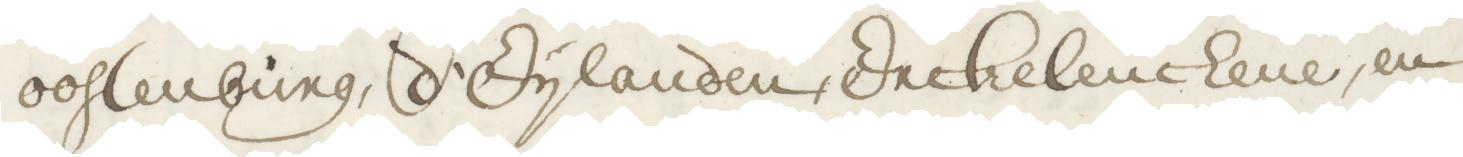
oostenburg, d’ Eijlanden, Erckelenchene, en
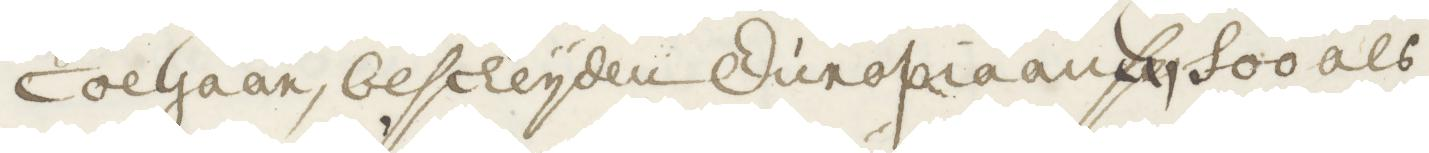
coetjaar, bescheijden Europiaanen Soo als
